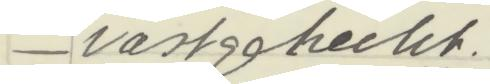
— vastgehecht.
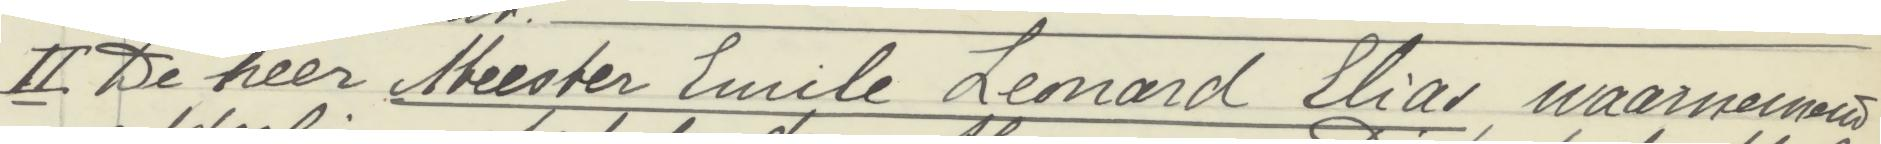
II. De heer Meester Emile Leonard Elias, waarnemend
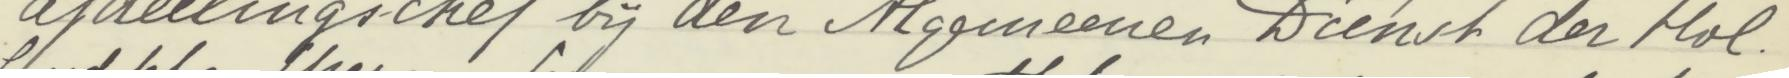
afdeelings-chef bij den Algemeenen Dienst der Hol.
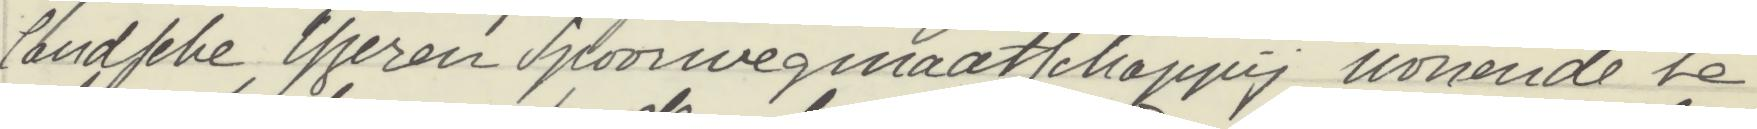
landsche Yzeren Spoorwegmaatschappij, wonende te
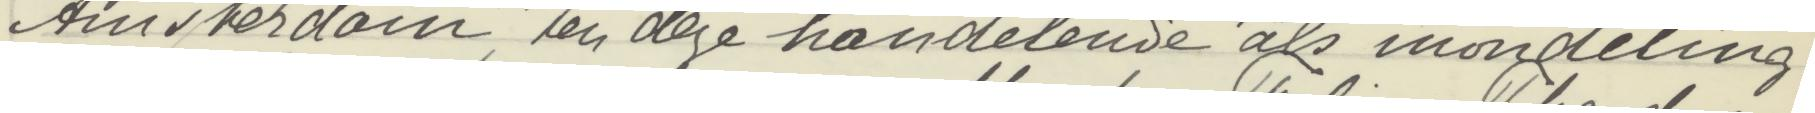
Amsterdam, ten deze handelende als mondeling
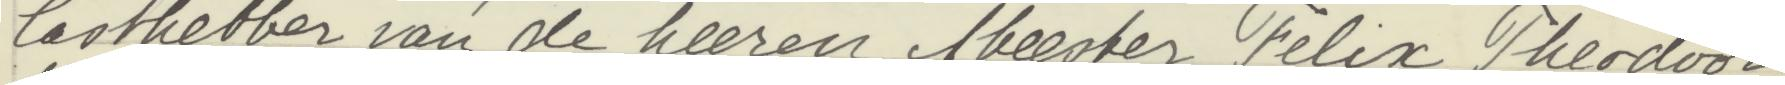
lasthebber van de heeren Meester Felix Theodoor
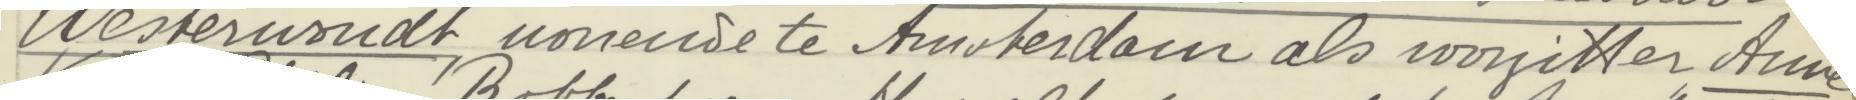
Westerwoudt, wonende te Amsterdam als voorzitter Anne
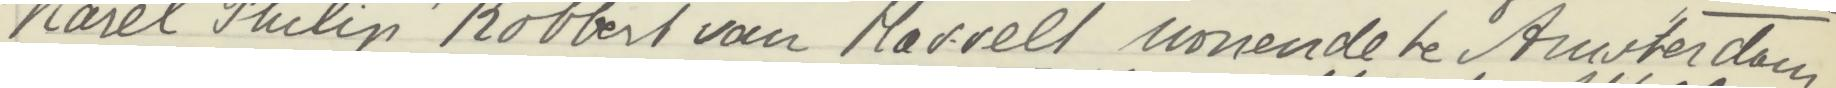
Karel Philip Robbert van Hasselt, wonende te Amsterdam
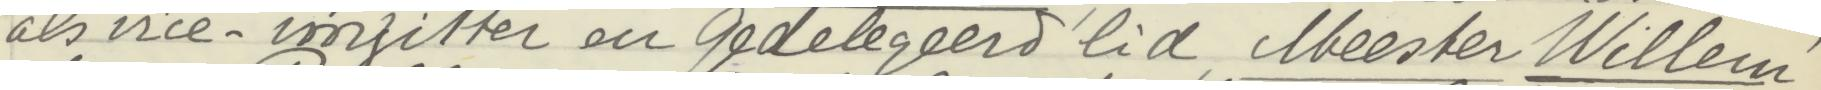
als vice-voorzitter en gedelegeerd lid, Meester Willem
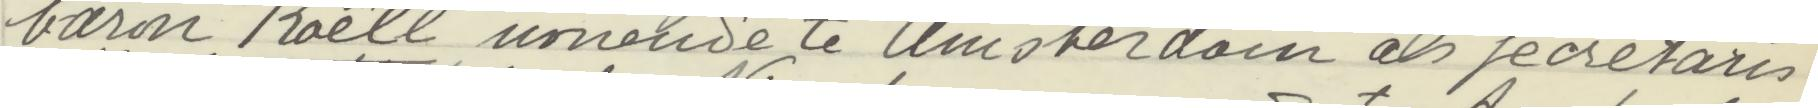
baron Roëll, wonende te Amsterdam als secretaris
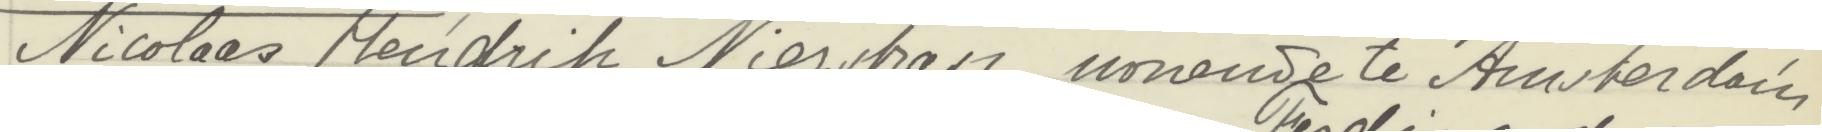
Nicolaas Hendrik Nierstrasz, wonende te Amsterdam
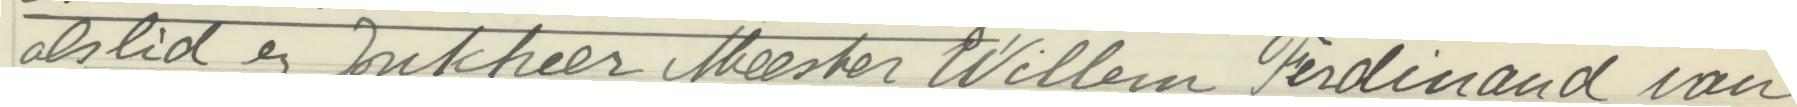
als lid en Jonkheer Meester Willem Ferdinand van
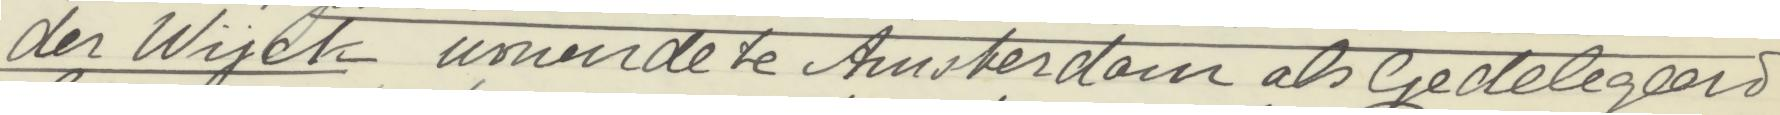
der Wijck, wonende te Amsterdam als Gedelegeerd
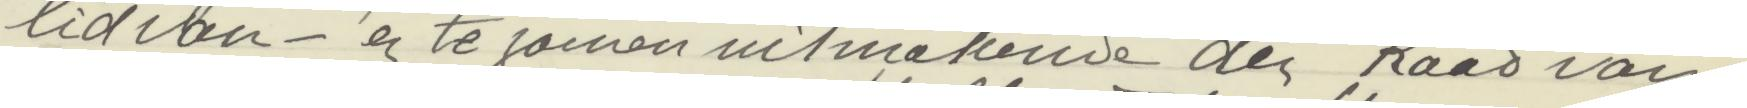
lid van - en te zamen uitmakende den Raad van
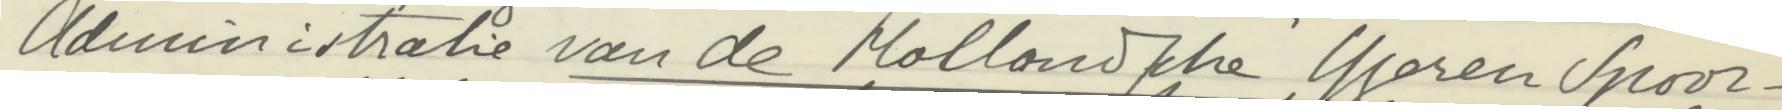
administratie van de Hollondsche Yzeren Spoor
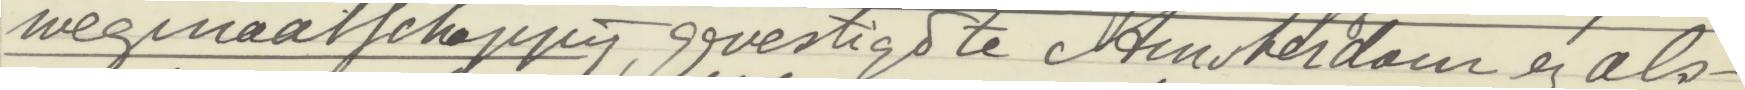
wegmaatschappij, gevestigd te Amsterdam en als-
